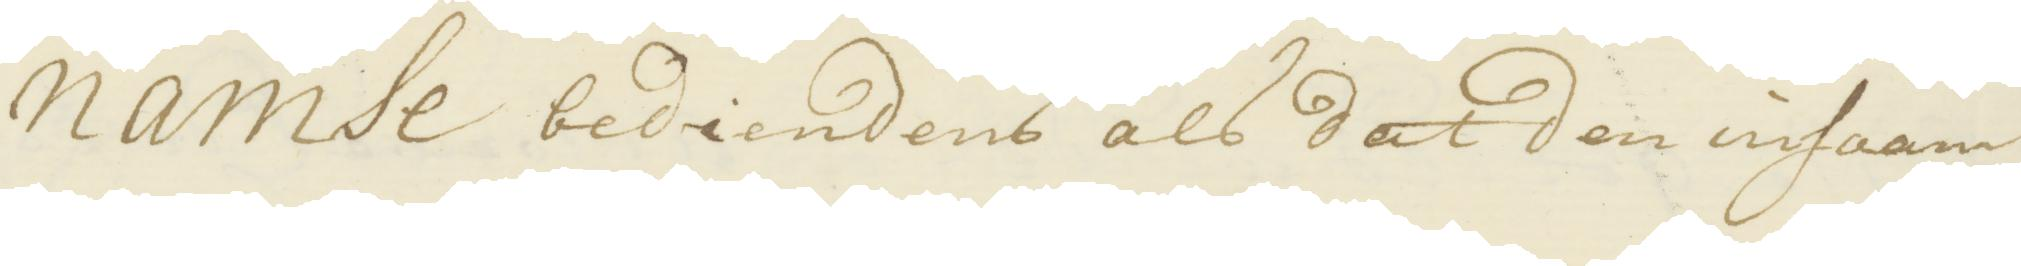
namse bediendens als dat den insaam
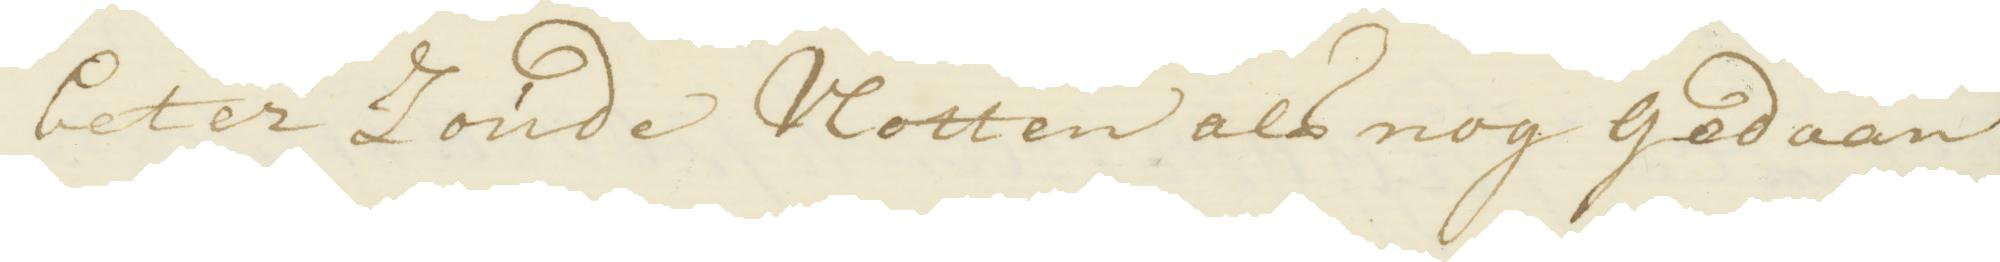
beter zoude vlotten als nog gedaan
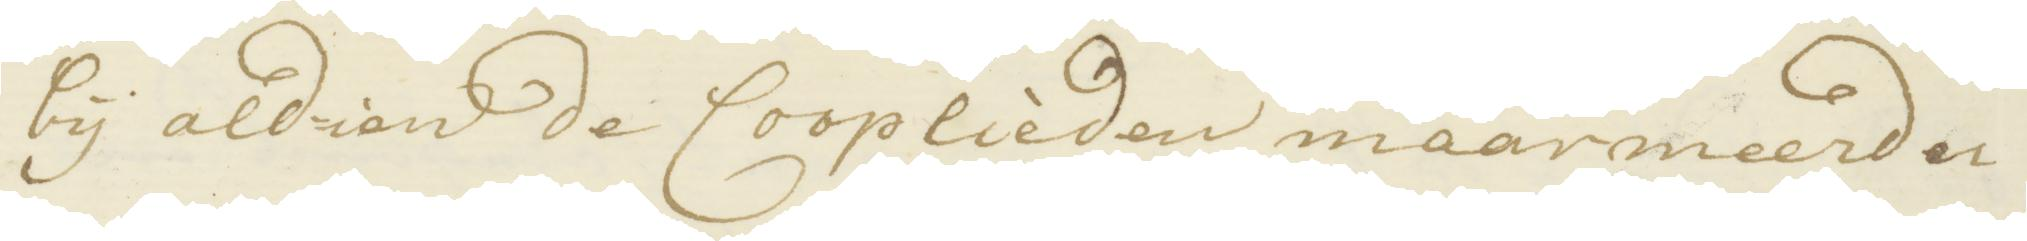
bij aldien de Cooplieden maar meerder
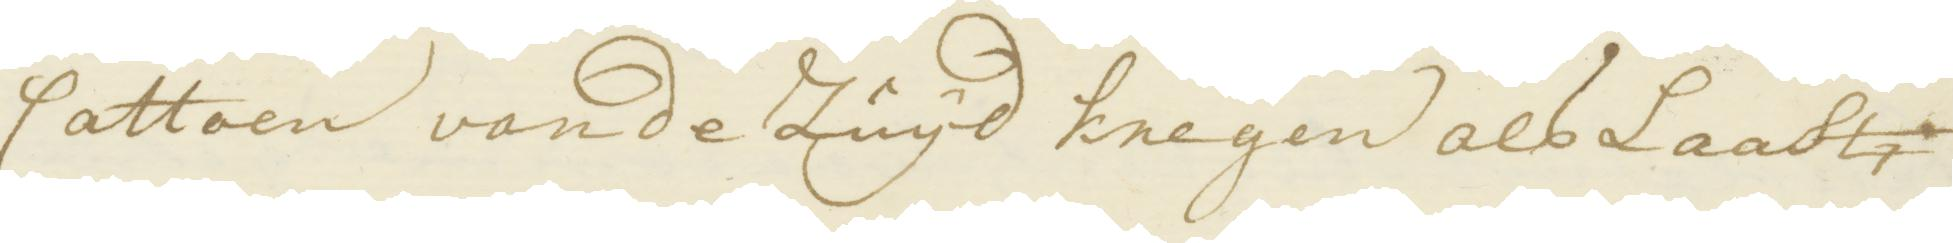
Cattoen van de zuijd kregen als laast,
